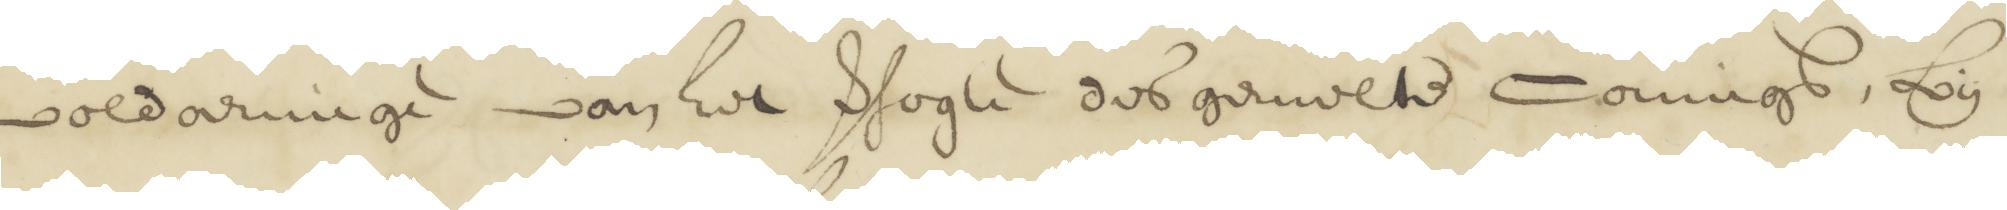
voldoeninge van het versogte des gemelte Conings, bij
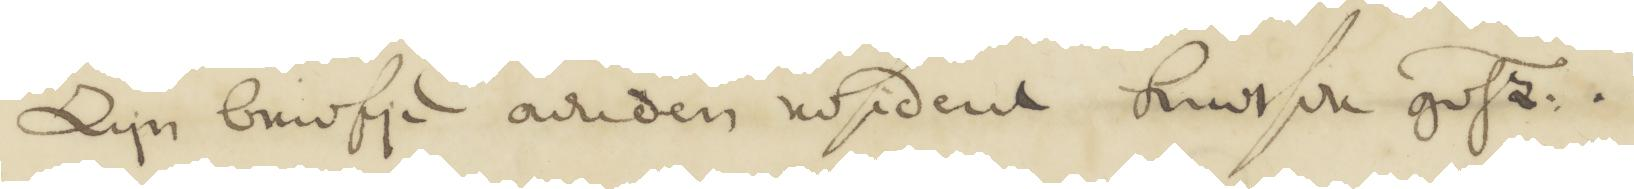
zijn briefje aenden resident smetser gesz:.
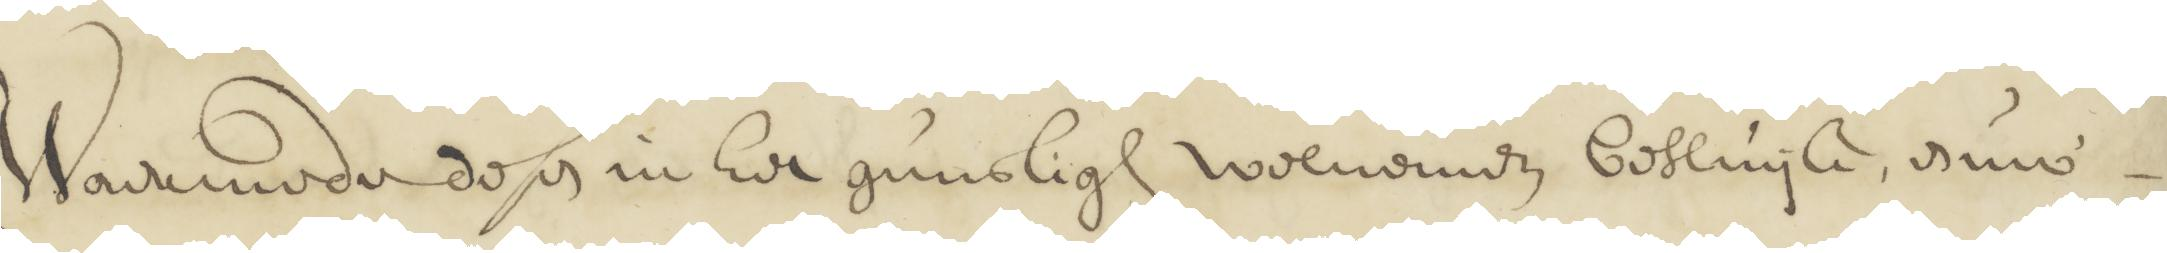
Waermede desen in het gunstigh welnemen besluijte, en uw
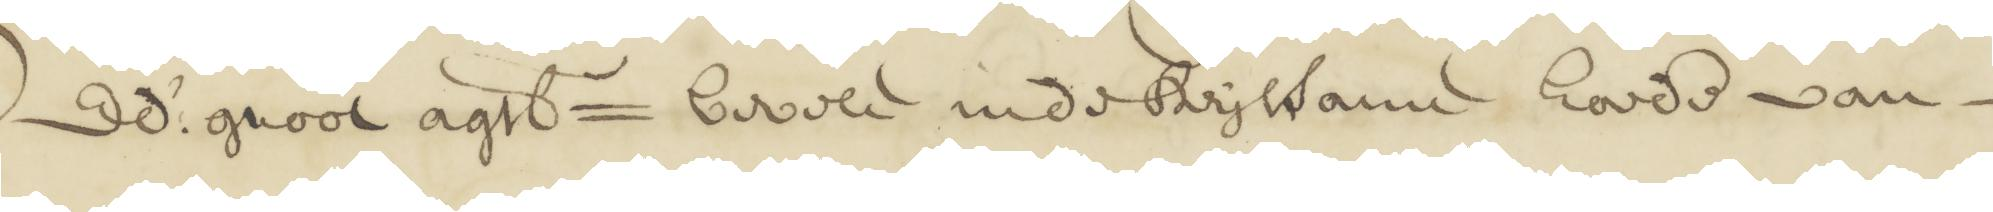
Ed: groot agtb= bevele in de Heijlsame hoede van
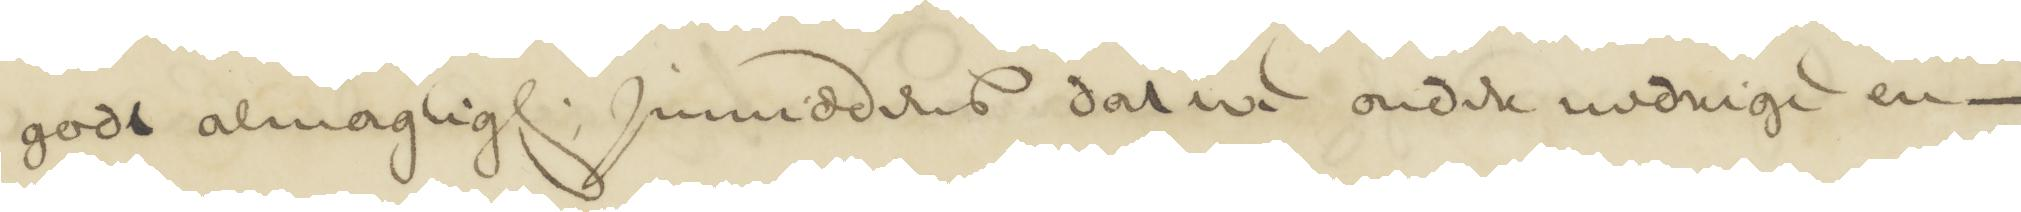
godt almagtigh: Jnmiddens dat we onder nedrige en —
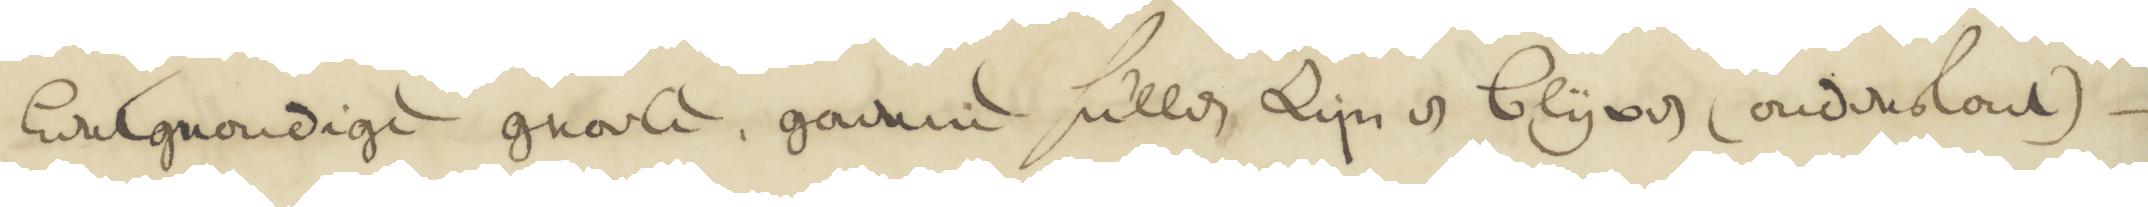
hertgrondige groete, gaerne sullen zijn en blijven (onderstont)
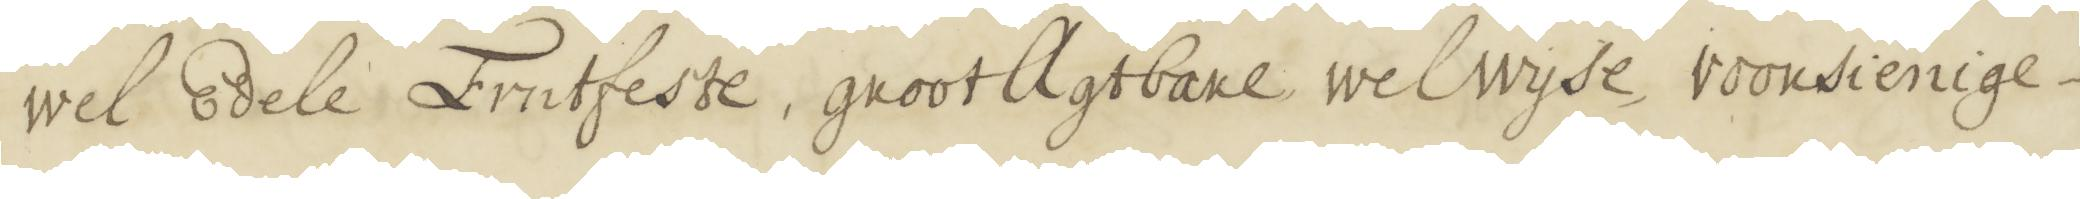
wel Edele Erntfeste, groot Agtbare welwijse, voorsienige
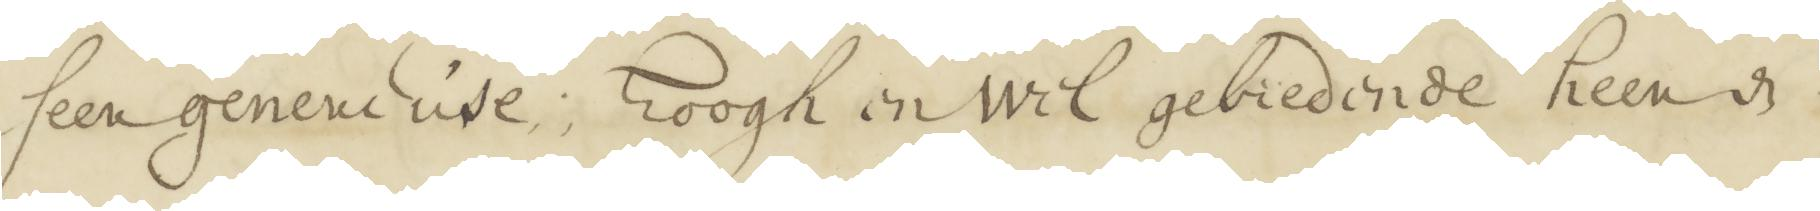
seer genereuse; hoogh en wel gebiedende heer en
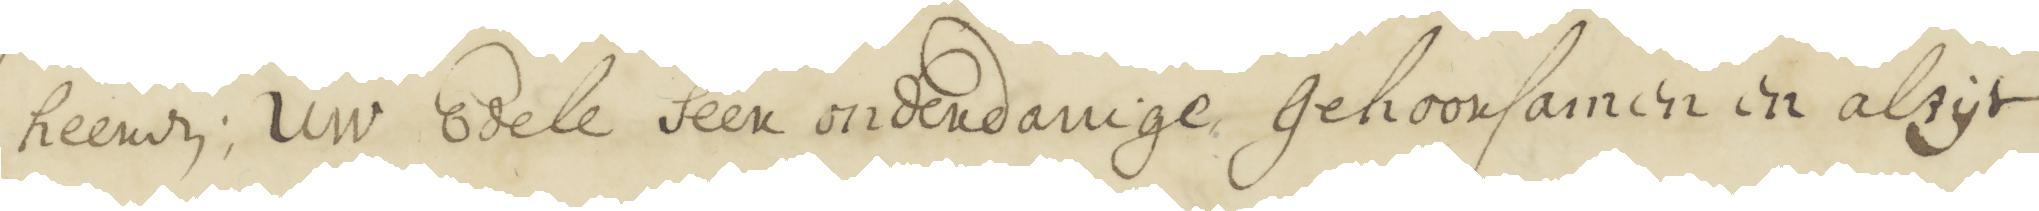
heeren; uw Edele seer onderdanige gehoorsamen en altijt
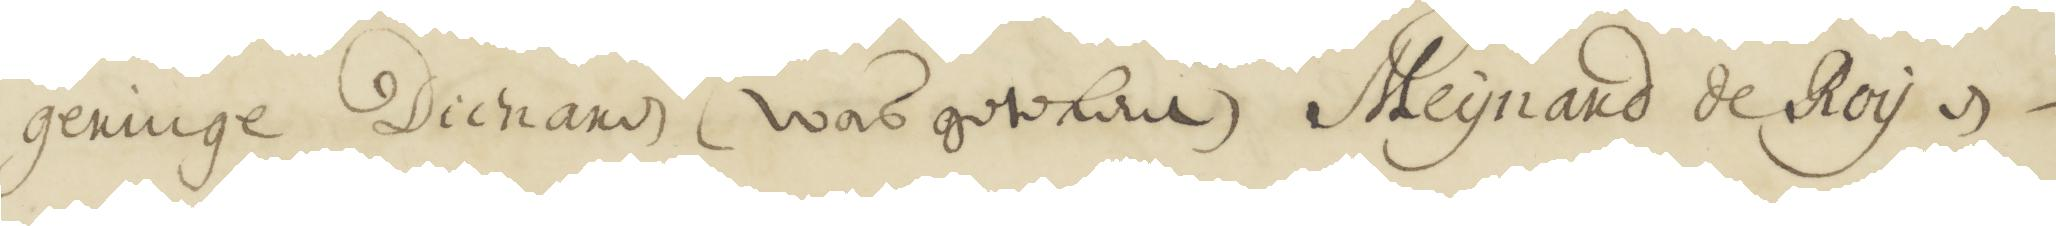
geringe Dienaren (was getekent) Meijnard de Roij en
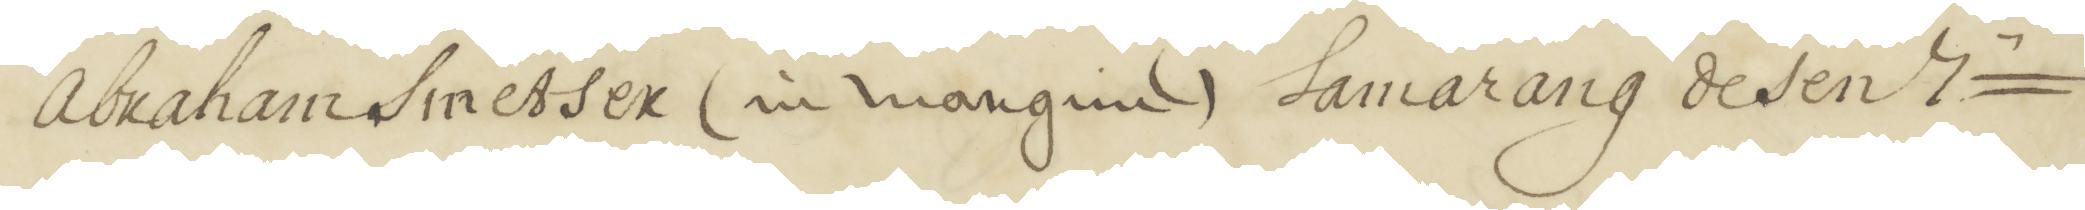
abraham smetser (in margine) samarang desen 7=en
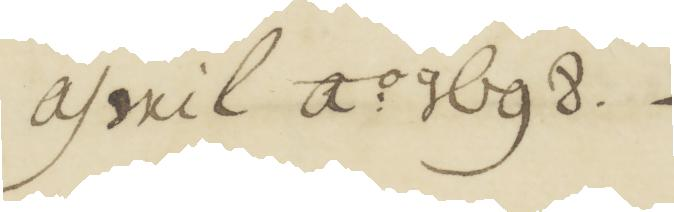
april a:o 1698.
